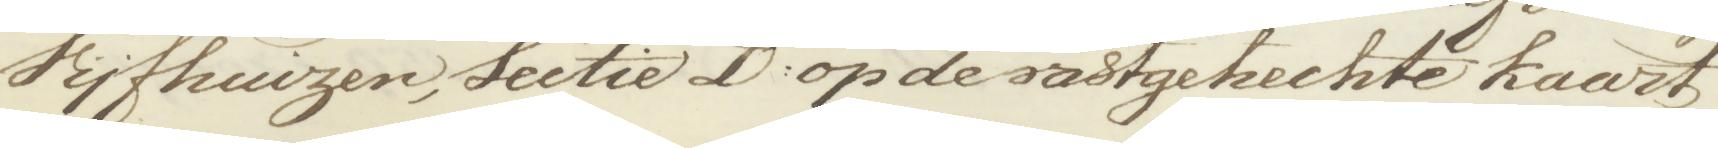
Vijfhuizen, sectie D: op de vastgehechte kaart
